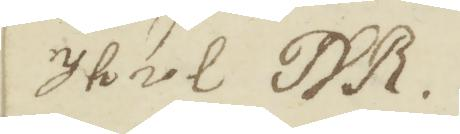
yhvl JVR.
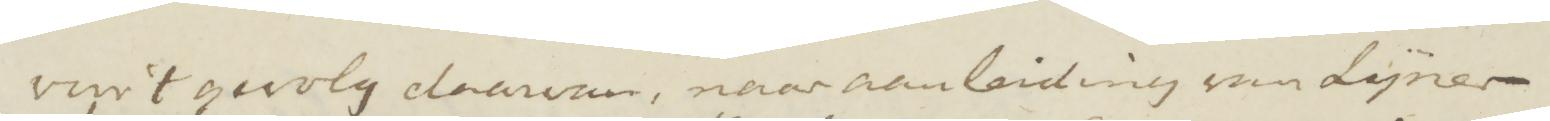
van't gevolg daarvan, naar aanleiding van Zijner
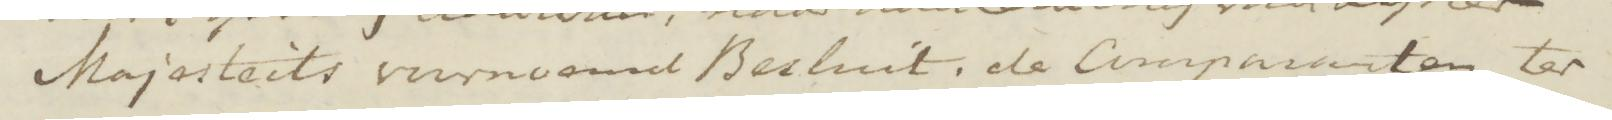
Majesteits voornoemd Besluit, de Comparanten ter
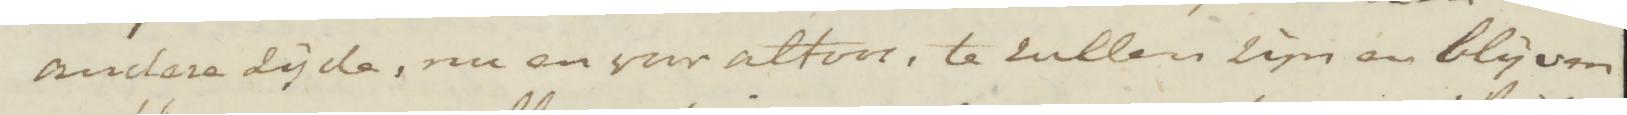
andere zijde, nu en voor altoos, te zullen zijn en blijven
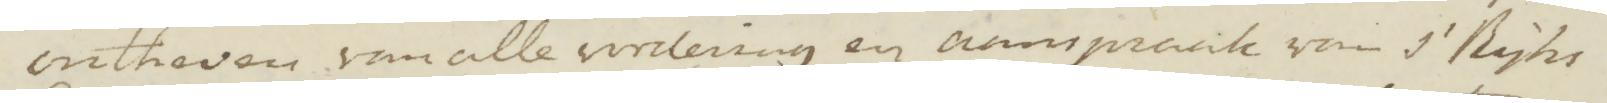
ontheven van alle vordering en aanspraak van s' Rijks
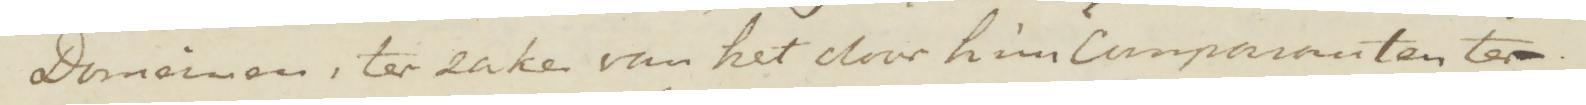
Domeinen, ter zake van het door hun Comparanten ter
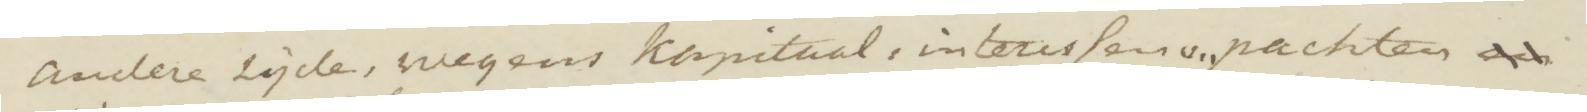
andere zijde, wegens kapitaal, interessen o,, pachten en
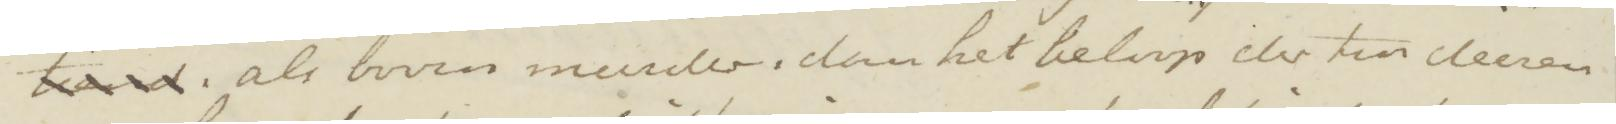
tiend als boven meerder, dan het beloop der ten deezen
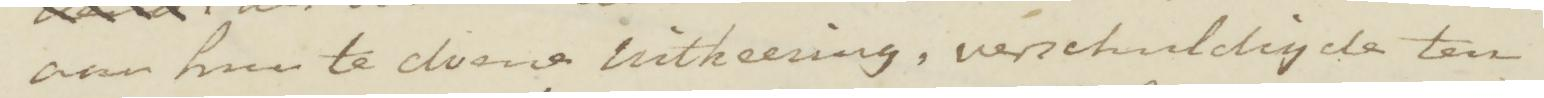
aan hun te doene uitkeering, verschuldigde ten
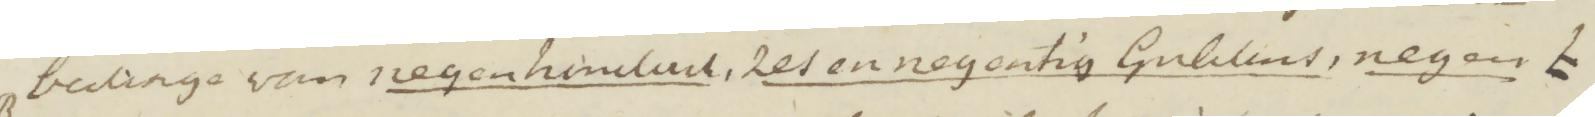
=bedinge van negenhonderd, zes en negentig Guldens, negen ¶
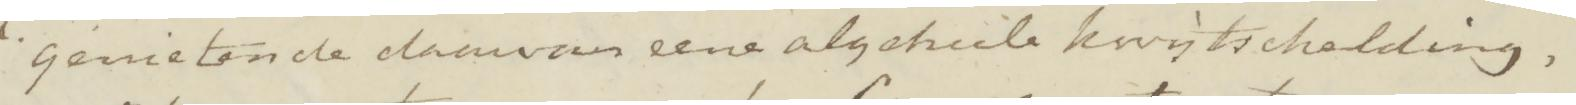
genietende daarvan eene algeheele kwijtschelding,
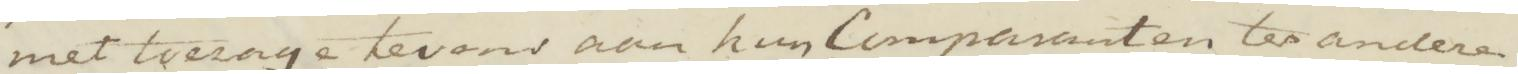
met toezorge tevens aan hun Comparanten ter andere
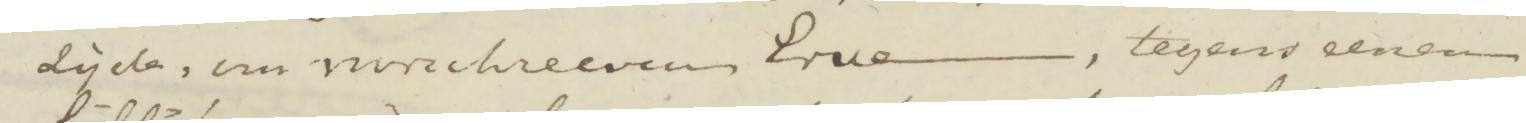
zijde, om voorschreeven Erve -„tegens eenen
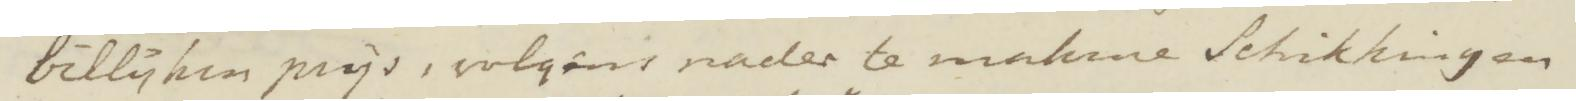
billijken prijs, volgens nader te makene Schikkingen
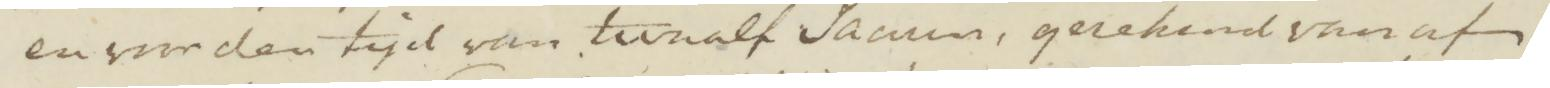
en voor den tijd van twaalf Iaaren, gerekend van af
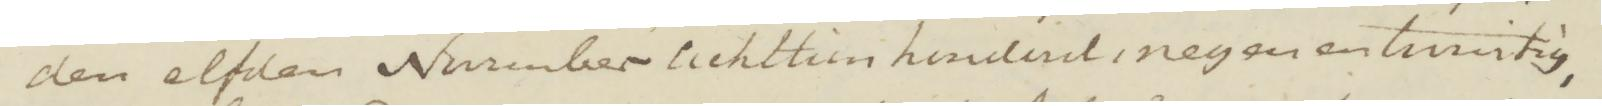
den elfden November Achttien honderd, negen en twintig,
